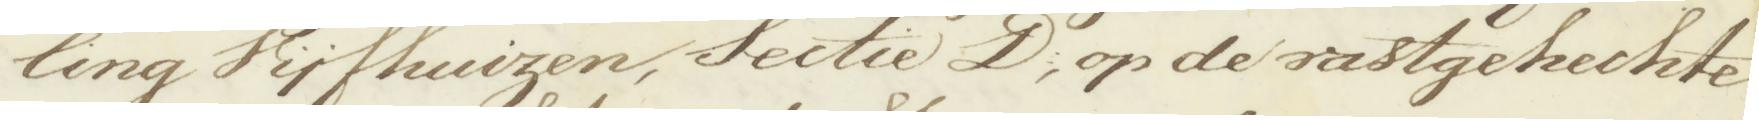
ling Vijfhuizen, sectie D:, op de vastgehechte
